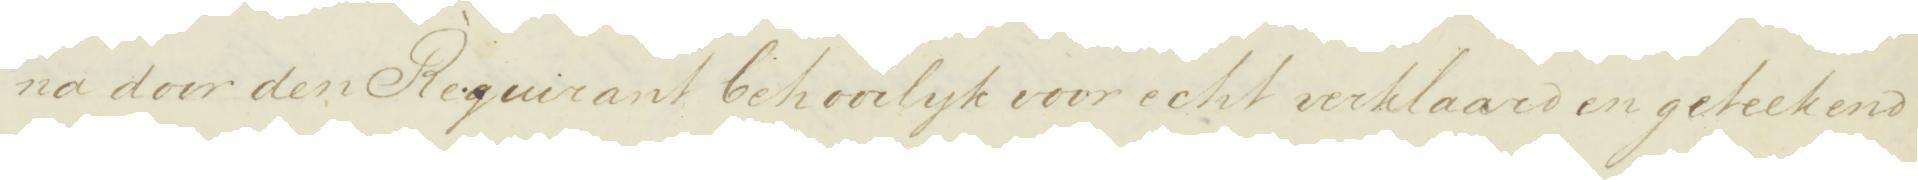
na door den Requirant behoorlyk voor echt verklaard en geteekend
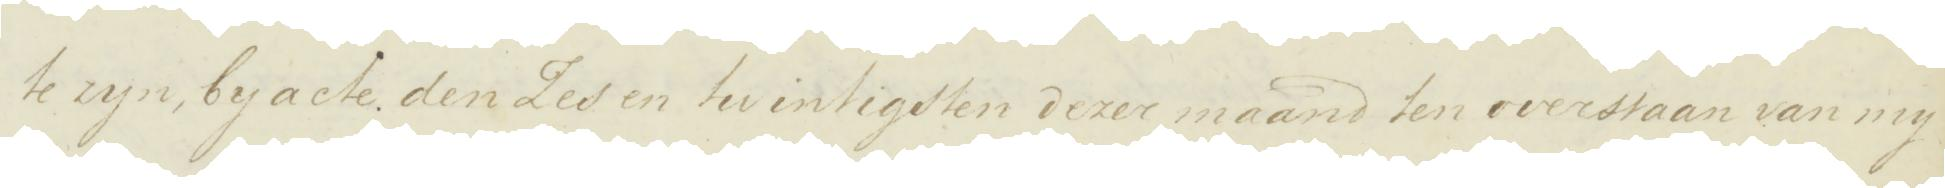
te zyn, by acte den Zes en twintigsten dezer maand ten overstaan van my
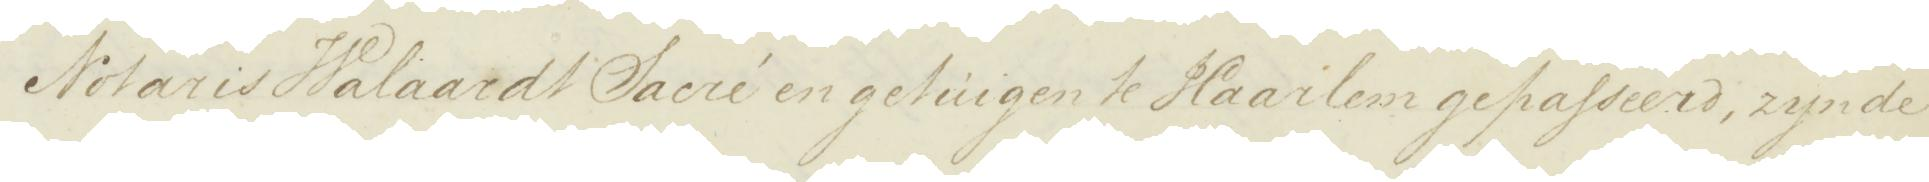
Notaris Walaardt Sacré en getuigen te Haarlem gepasseerd, zynde
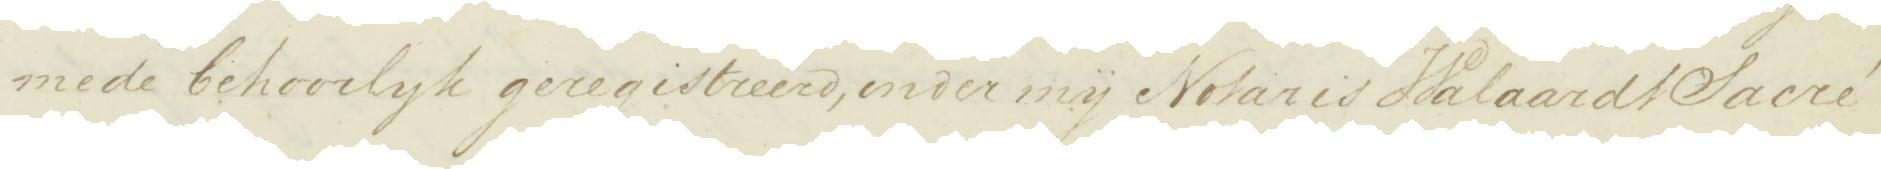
mede behoorlyk geregistreerd, onder mij Notaris Walaardt Sacré
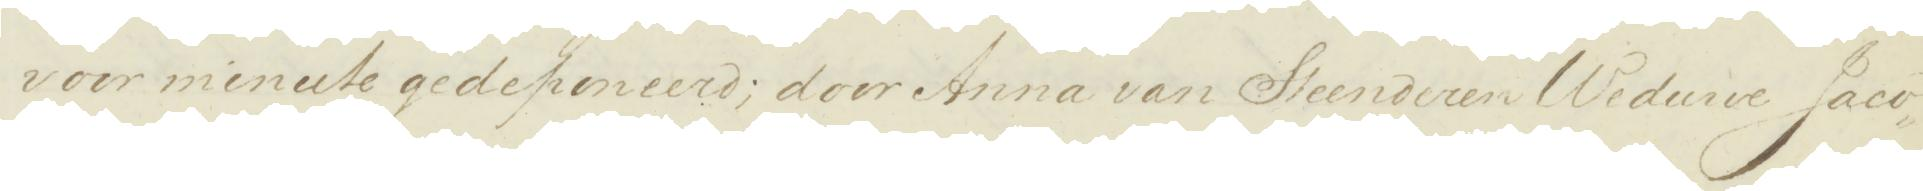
voor minute gedeponeerd; door Anna van Steenderen Weduwe Jaco„
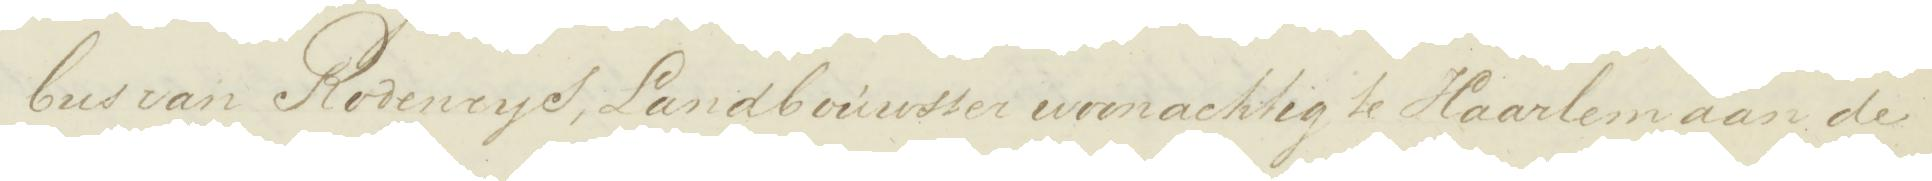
bus van Rodenrys, Landbouwster woonachtig te Haarlem aan de
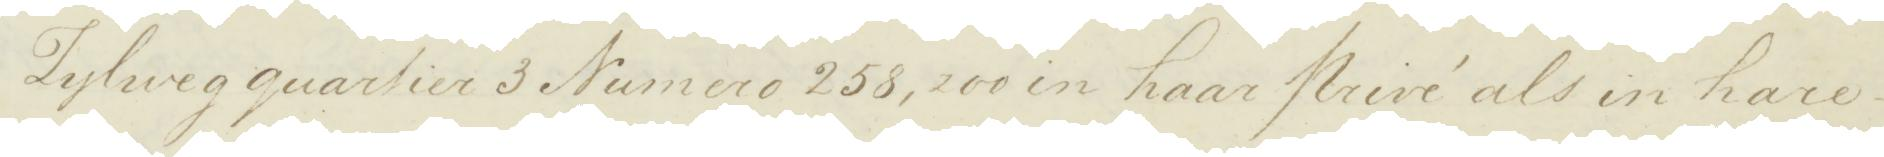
Zylweg quartier 3 Numero 258, zoo in haar Privé als in hare
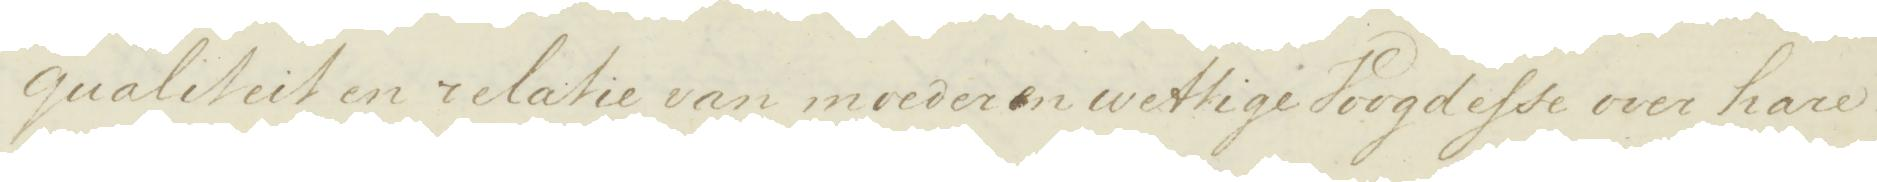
qualiteit en relatie van moeder en wettige Voogdesse over hare
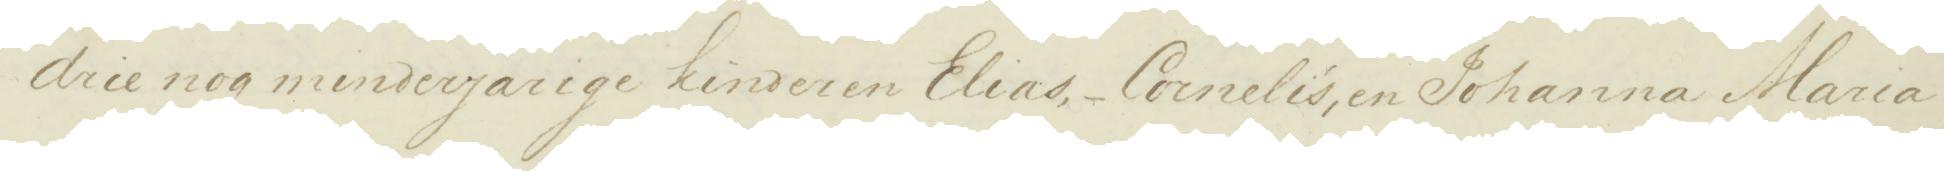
drie nog minderjarige kinder en Elias, - Cornelis, en Johanna Maria
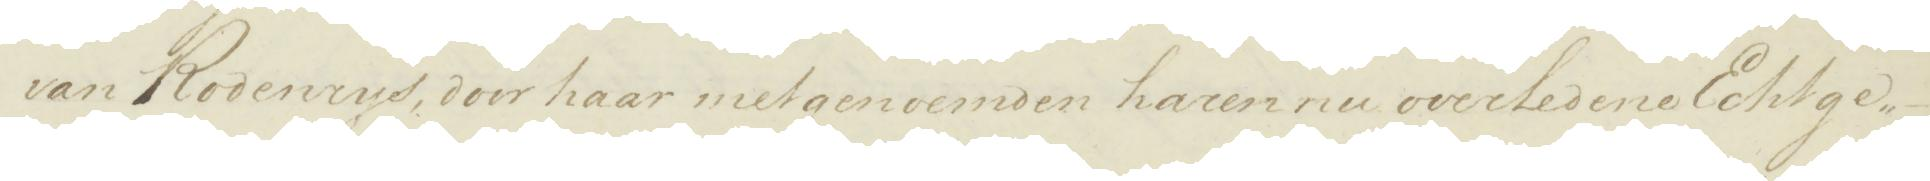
van Rodenrys, door haar met genoemden haren nu overledene Echtge„
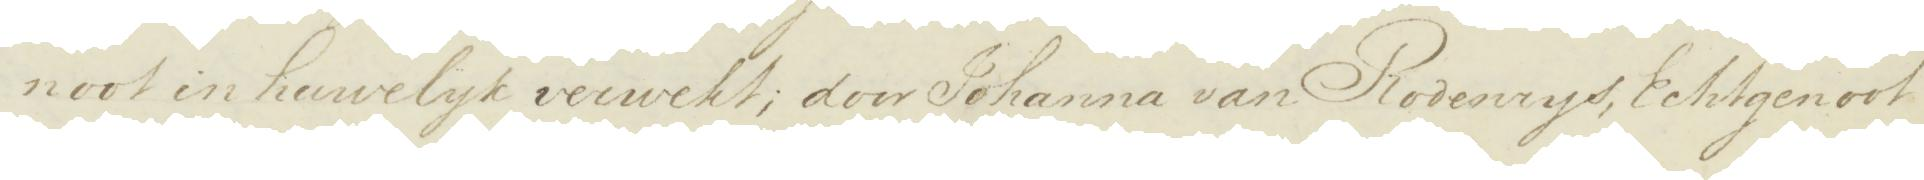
noot in huwelyk verwekt; door Johanna van Rodenrys, Echtgenoot
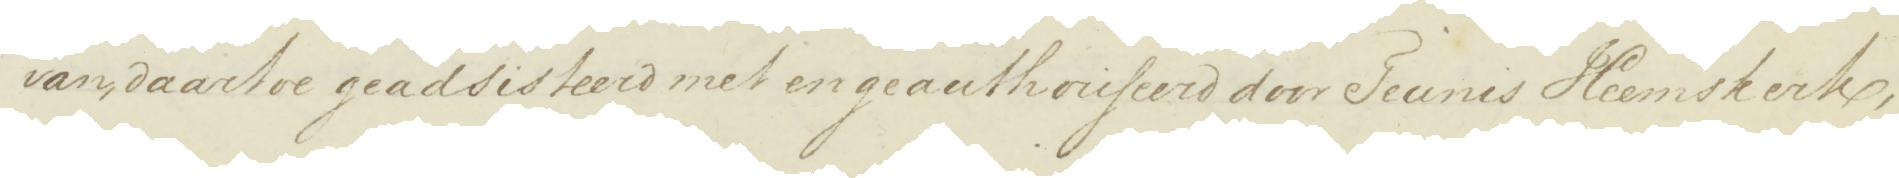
van, daar toe geadsisteerd met en geauthoriseerd door Teunes Heemskerk,
